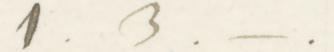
1. 3. —.
